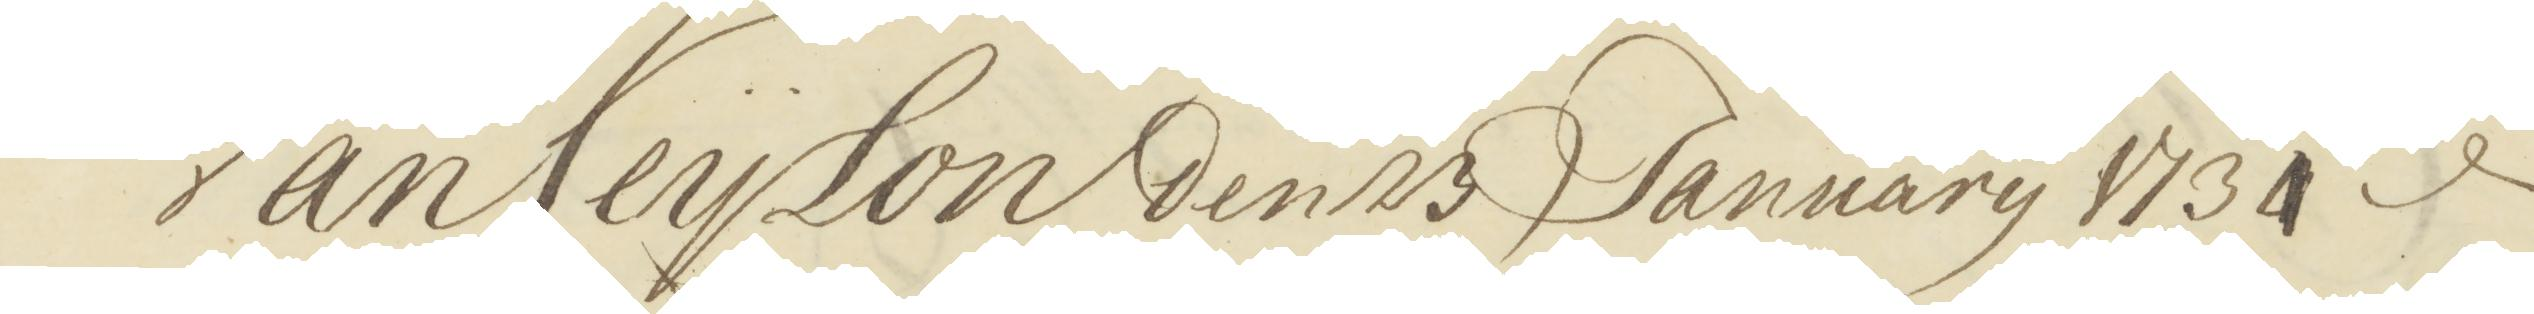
Van Ceijlon den 23 Ianuarij 1734 ~
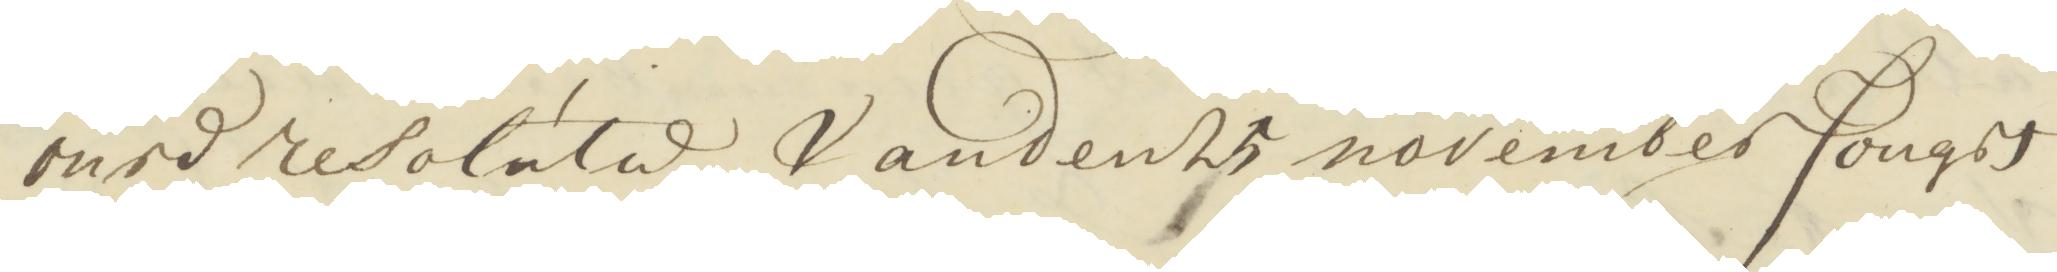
onse resolutie van den 25 november Jongst
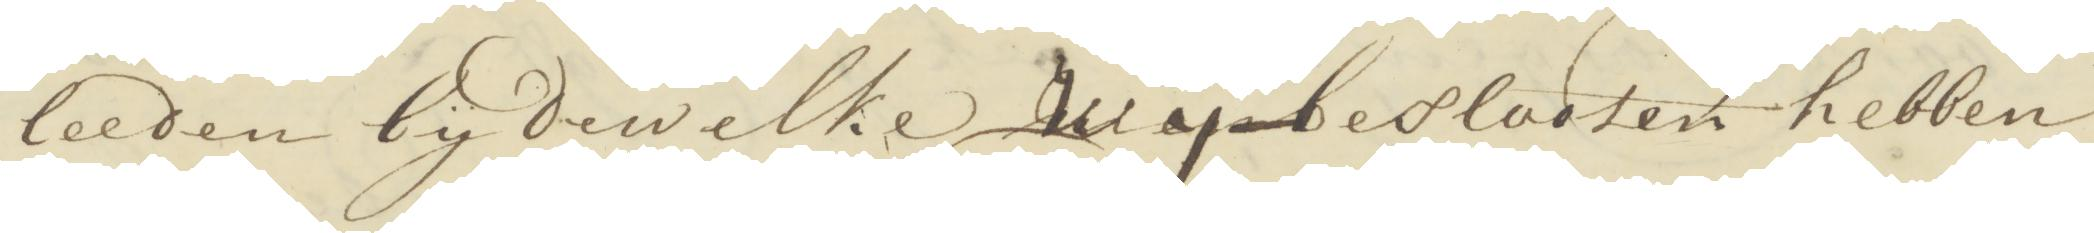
leeden bij dewelke wij beslooten hebben;
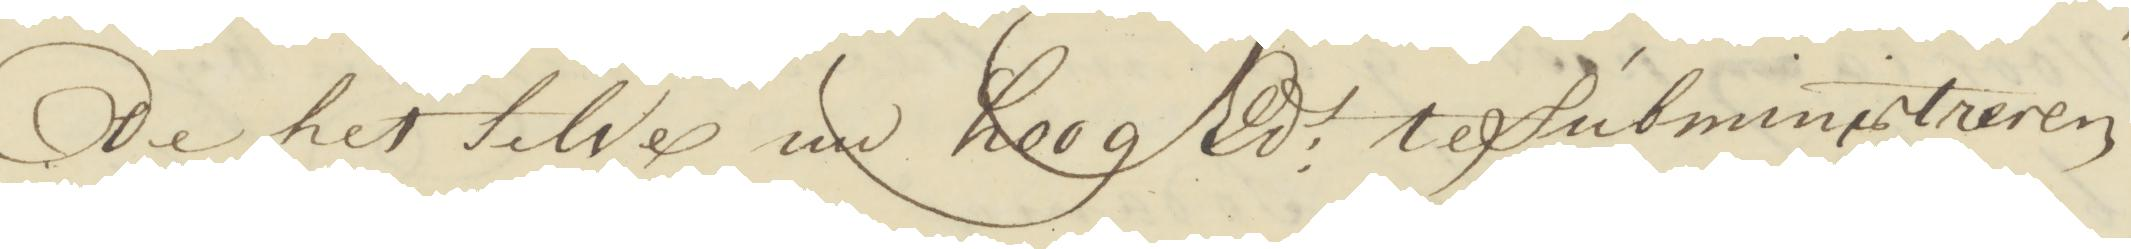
de het selve uw hoog Ed:s te Subministreren
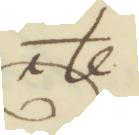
^te
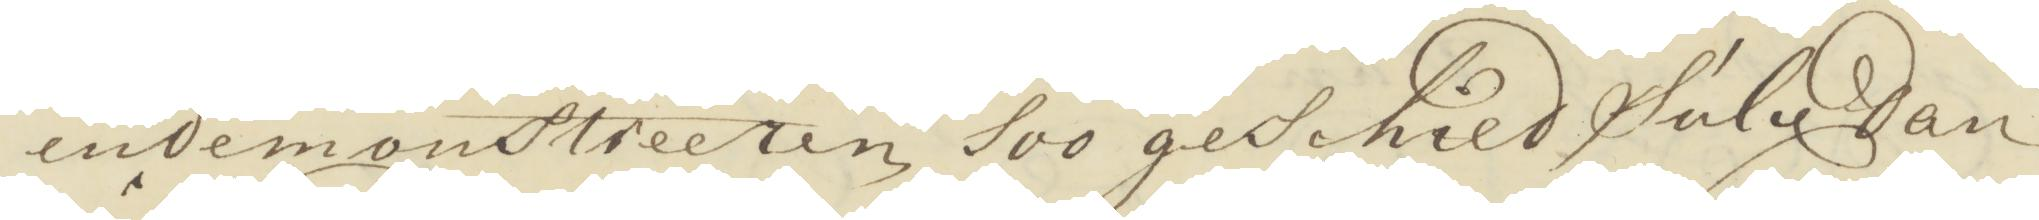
en ^ demonstreeren soo geschied Sulx dan
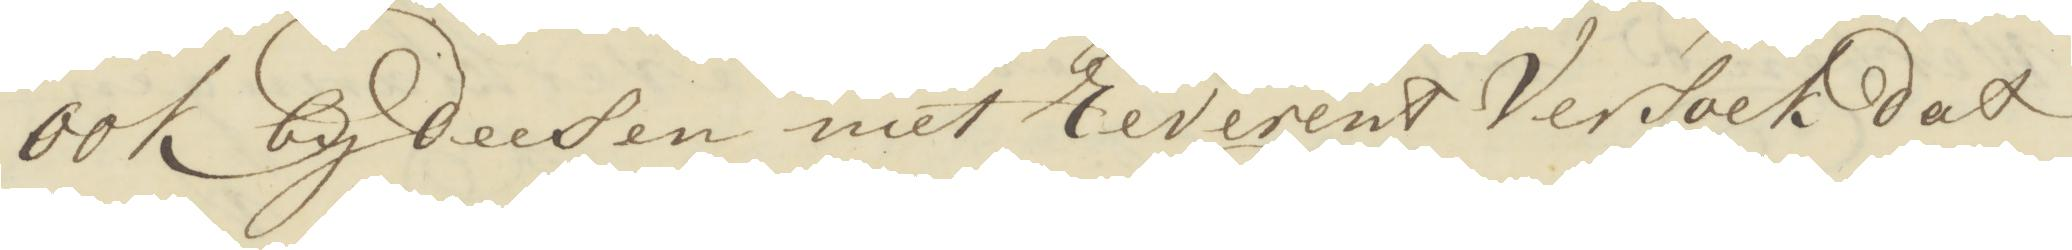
ook by deesen met Reverent Versoek dat
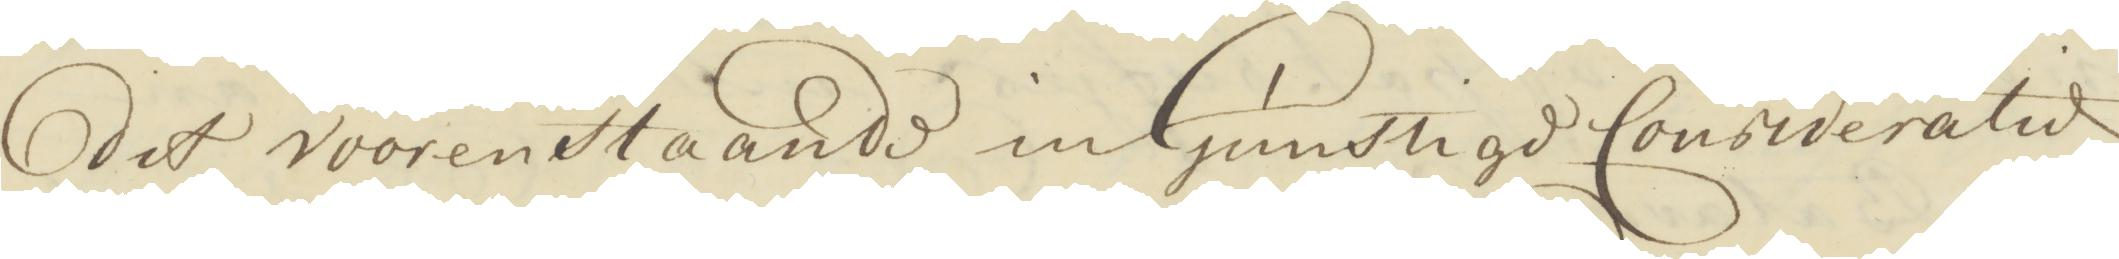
dit voorenstaande in Gunstige Consideratie
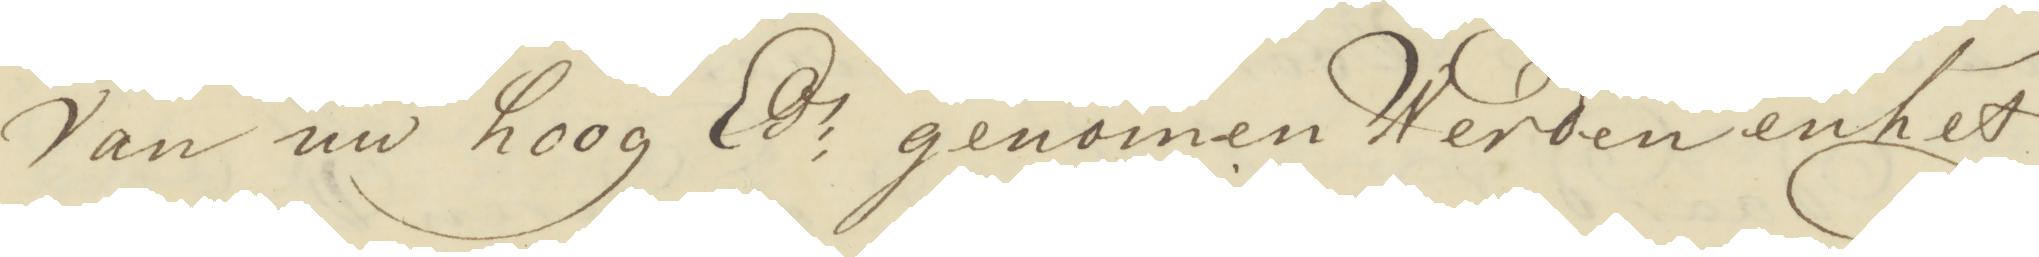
van uw hoog Ed„s genomen Werden en het
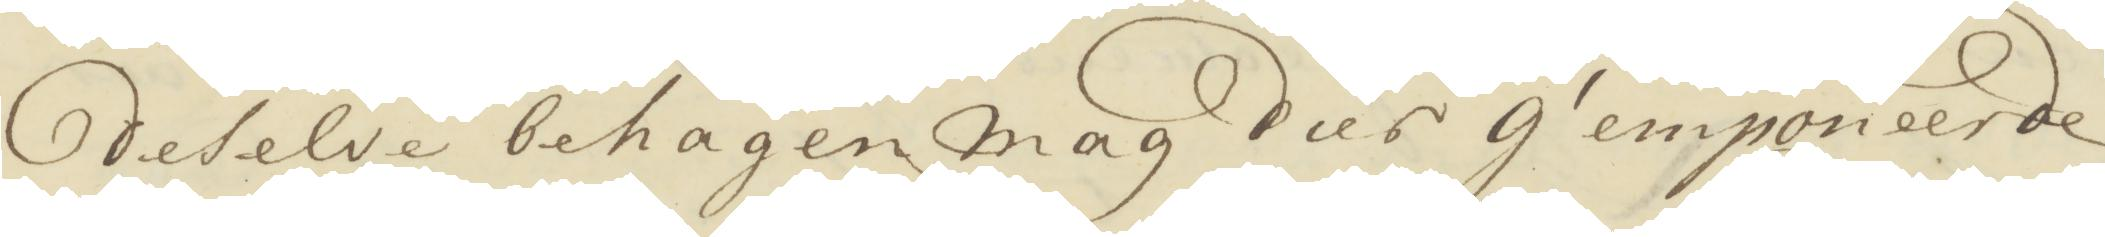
deselve behagen mag dies g’emponeerde
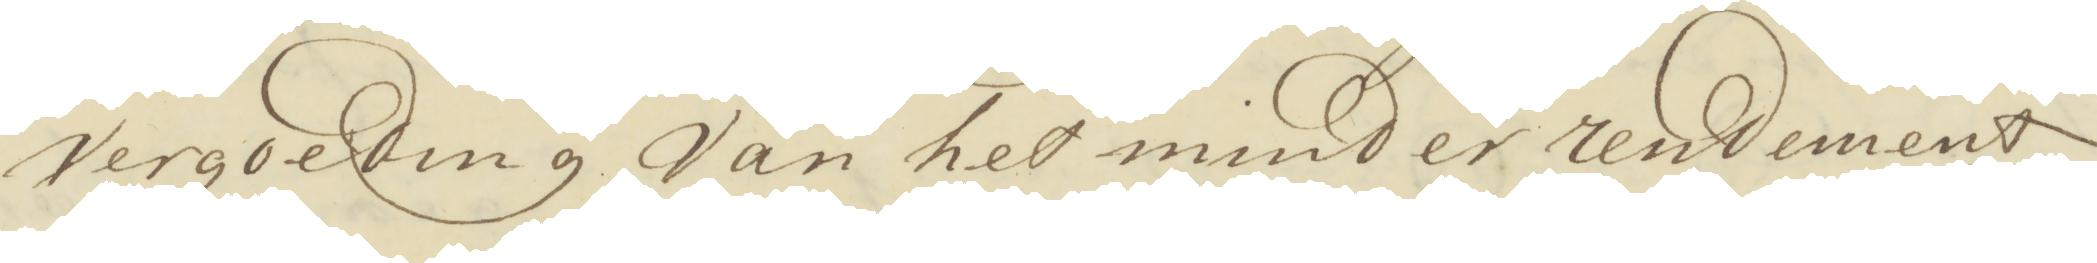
vergoeding van het minder rendement
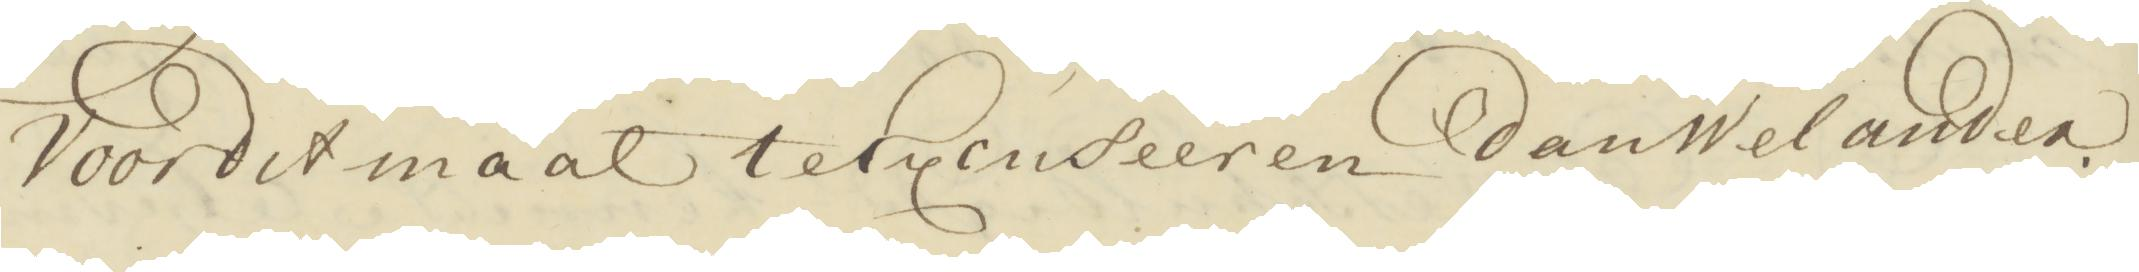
voor dit maal te Excuseeren dan wel ander
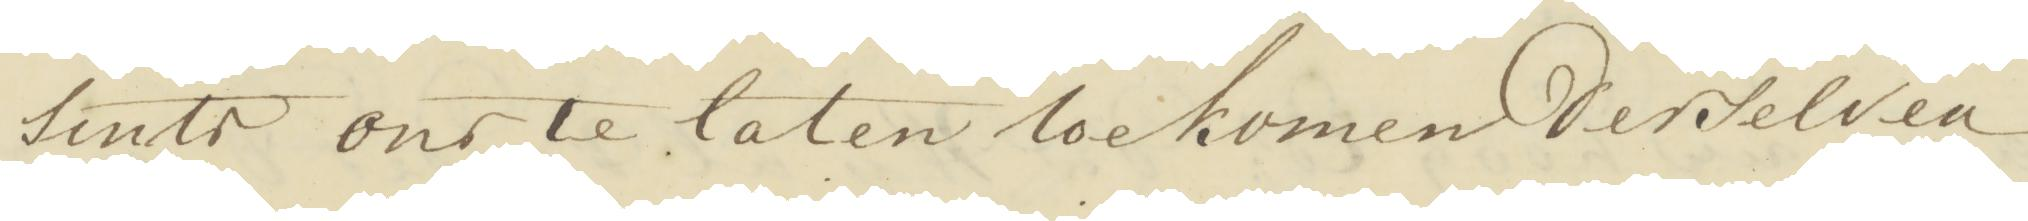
sints ons te laten toekomen derselver
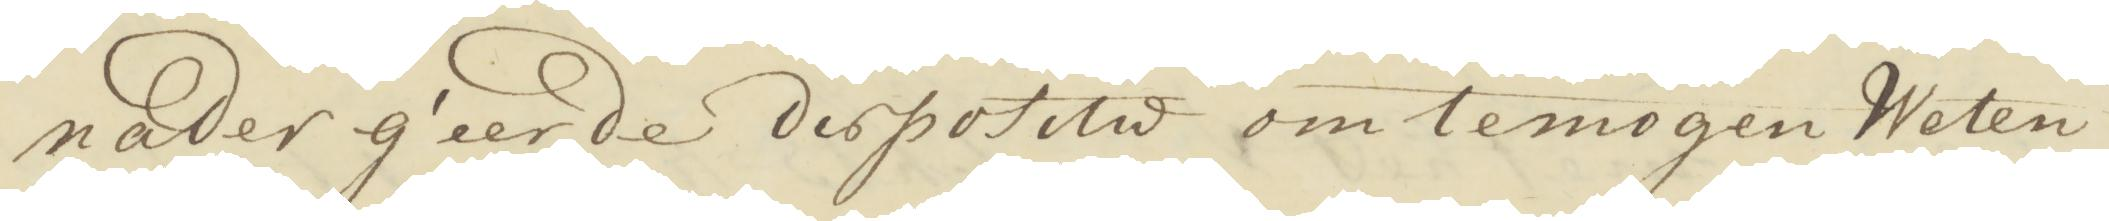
nader g’eerde dispositie om te mogen Weten
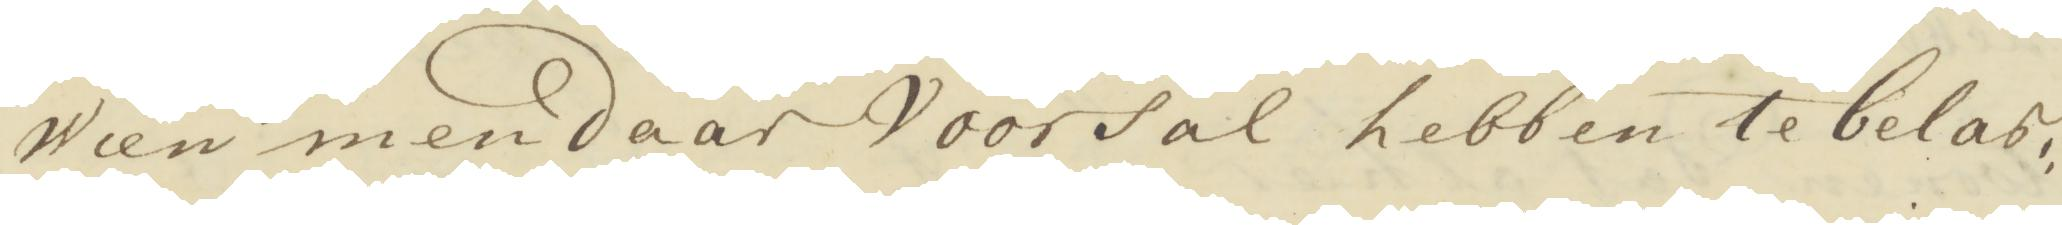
wien men daar voorsal hebben te belas„
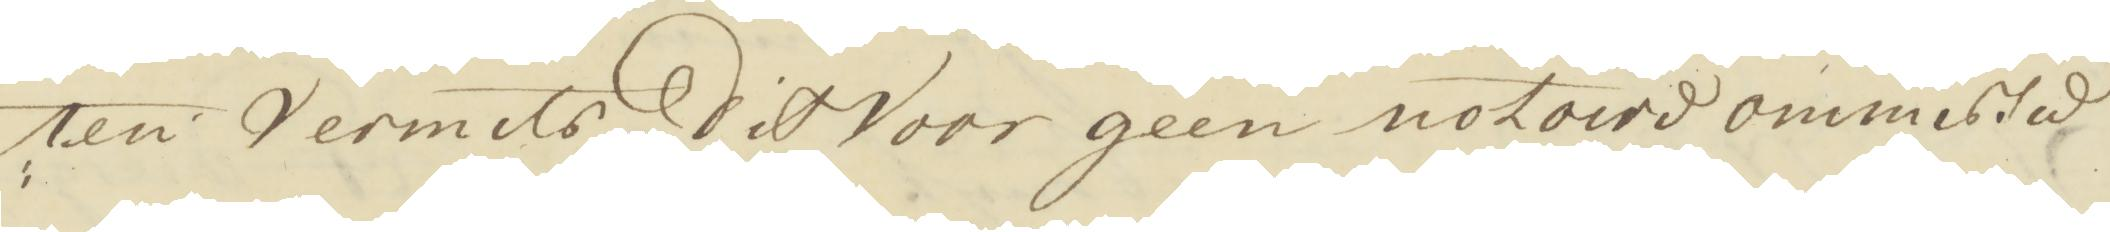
„ten Vermits dit voor geen notoire ommissie
